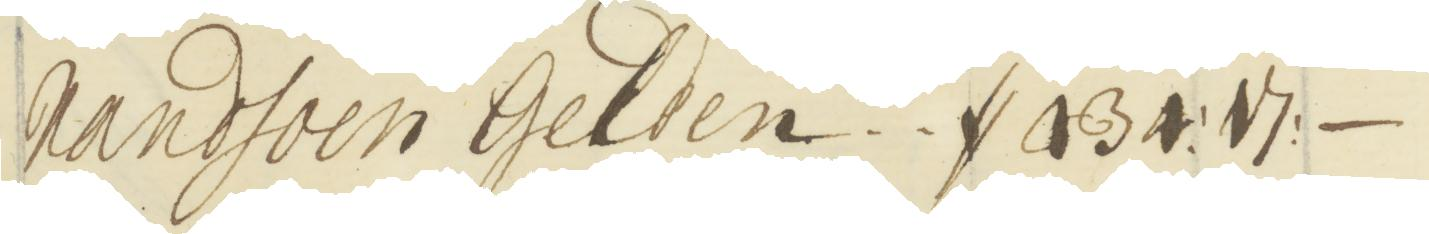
Randsoen Gelden - - ƒ 434: 17: —
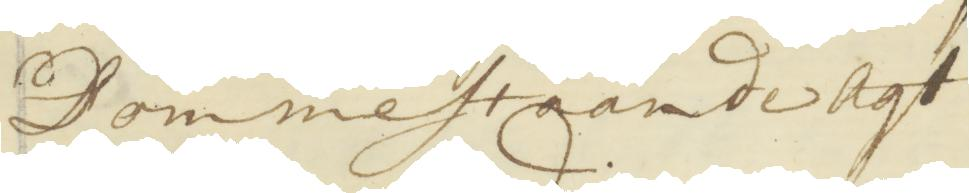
D ommestaande Agt
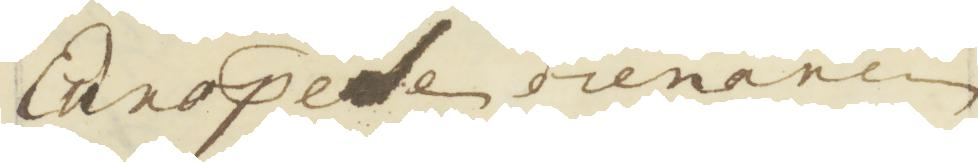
Europese dienaren
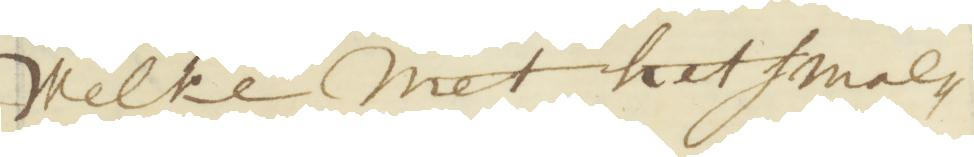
Welke Met het smal„
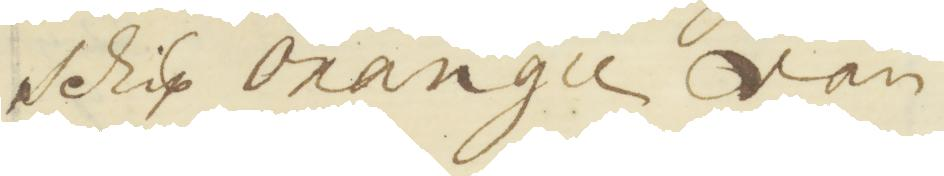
schip Orangie van
